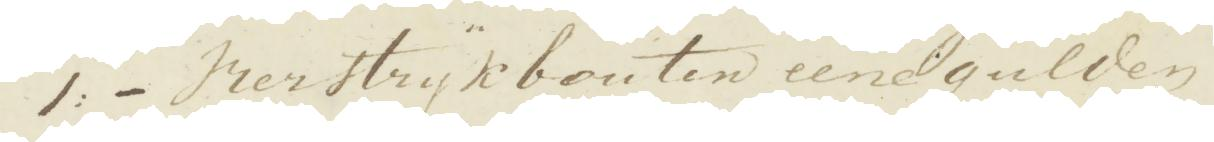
1: — Vier strijkbouten eene gulden
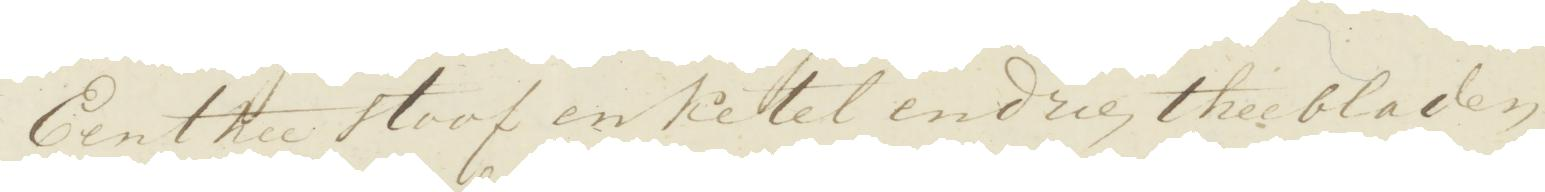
Een thee stoof en ketel en drie theebladen
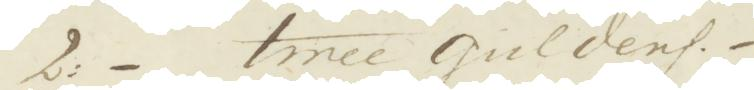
2: — twee guldens.-
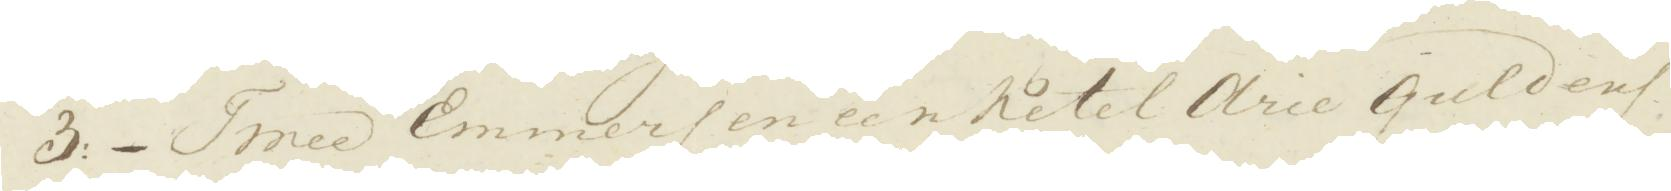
3: — Twee Emmers en een Ketel drie guldens.
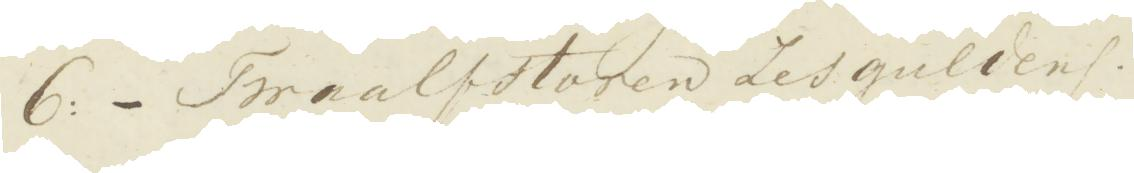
6: — Twaalf stoven zes guldens.
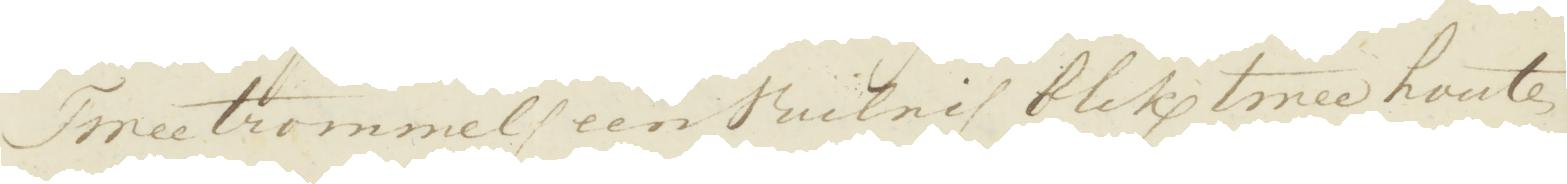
Twee trommels een vuilnis blik twee houte
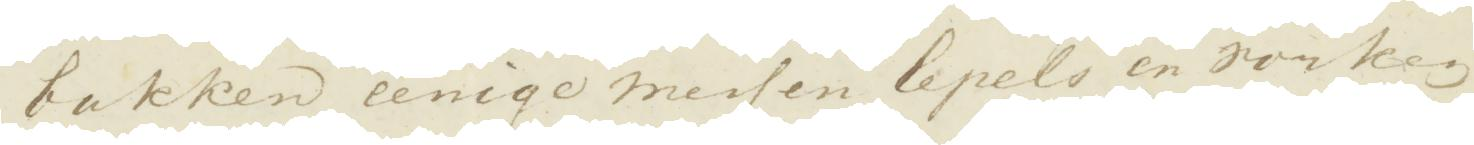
bakken eenige messen lepels en vorken
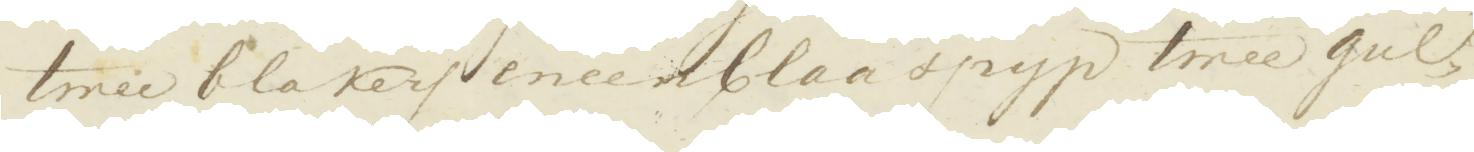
twee blakers en een blaaspijp twee gul„
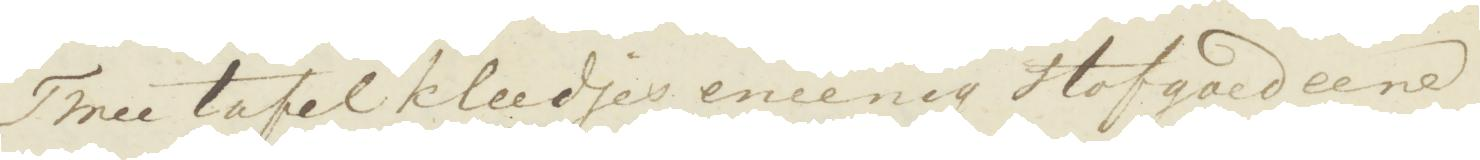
Twee tafel kleedjes en eenig stofgoed eene
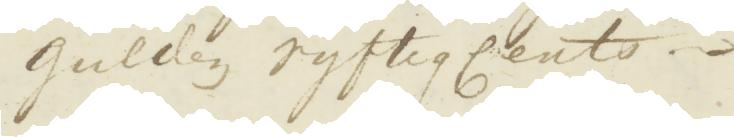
gulden vijftig cents.
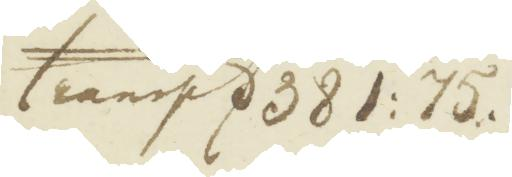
Transp ƒ381:75.
